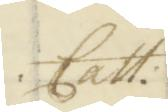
Catt:
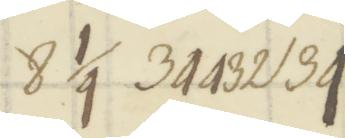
8¼ 3443234
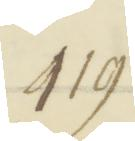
419
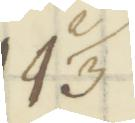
4 2/3
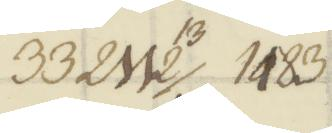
332112 13/16 1483
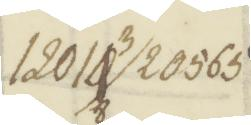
12014 3/8 20565
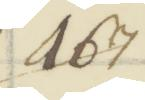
467
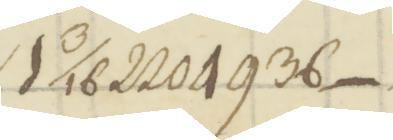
1 3/16 2204936—
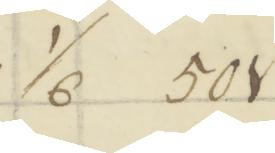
1/6 501
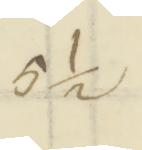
5½
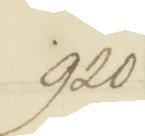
920
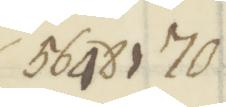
56481 70
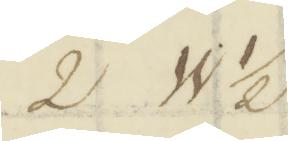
2 11½
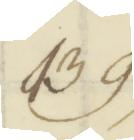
43 9
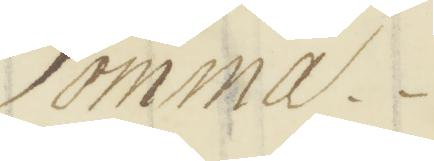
Somma . .
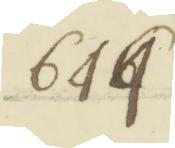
644
